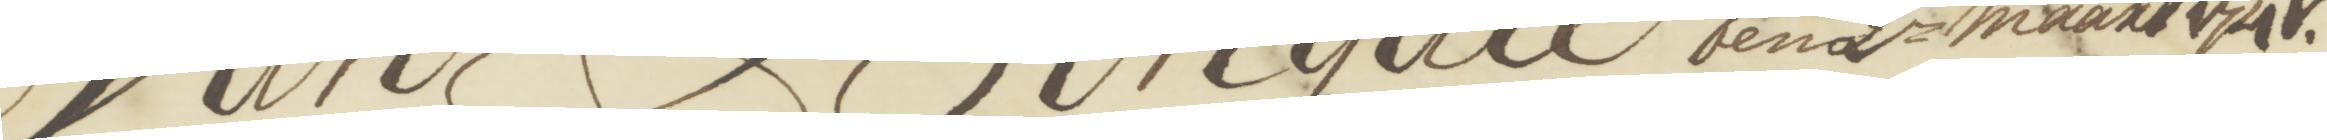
Van Bengale den 2=' maart 1741.
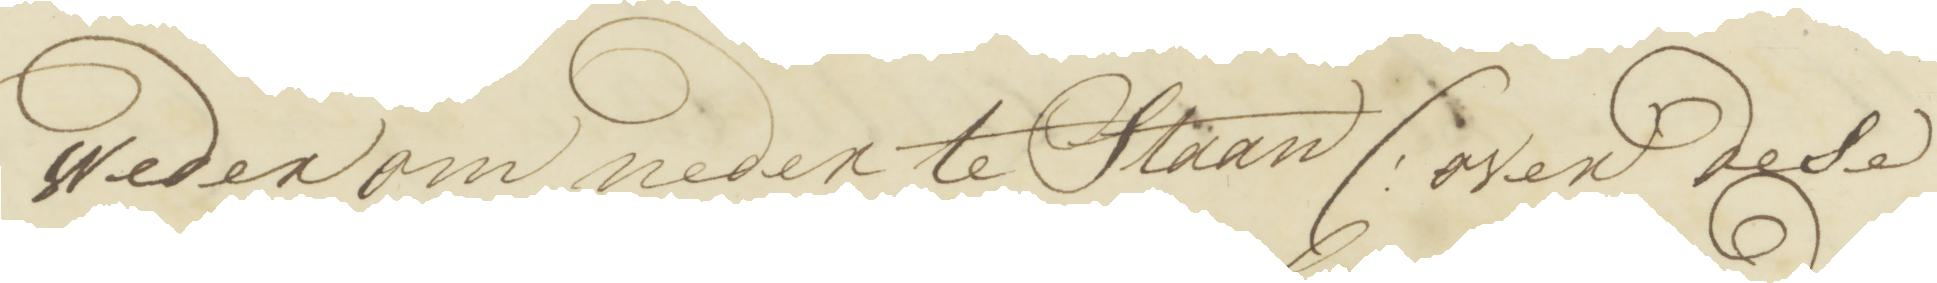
weder om neder te staan (:over dese
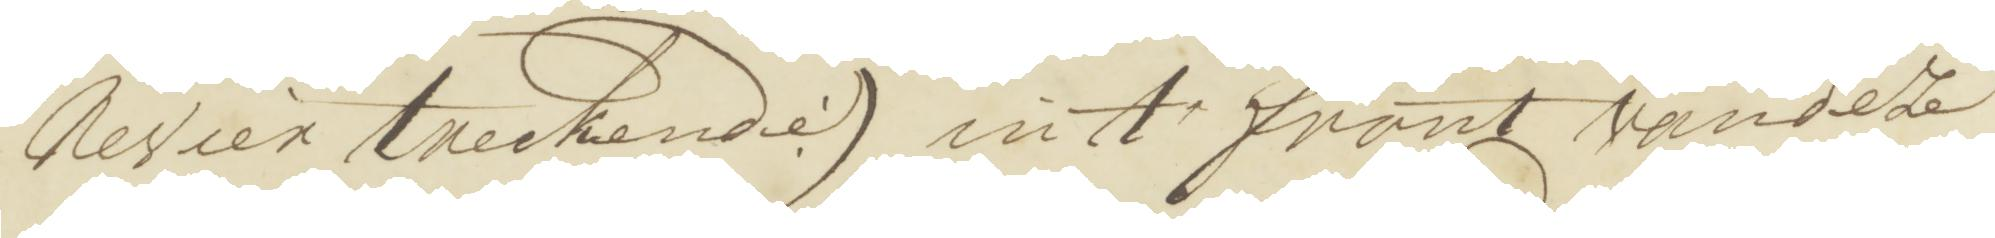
Revier treckende:) in t' front van deze
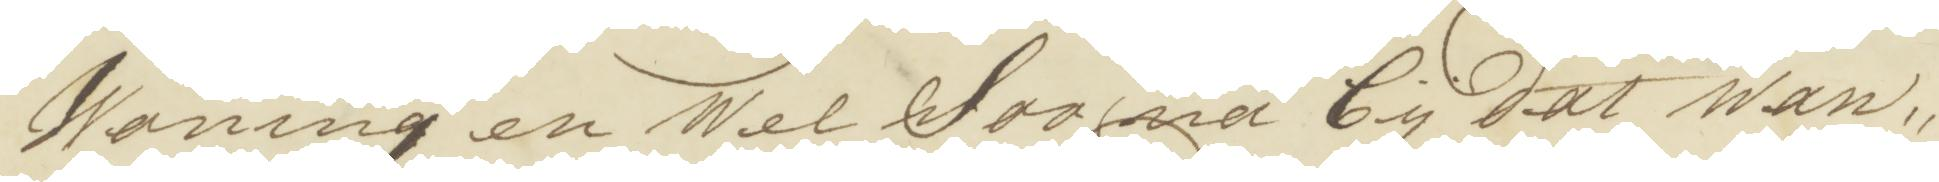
Woning en wel Soo na bij dat wan„
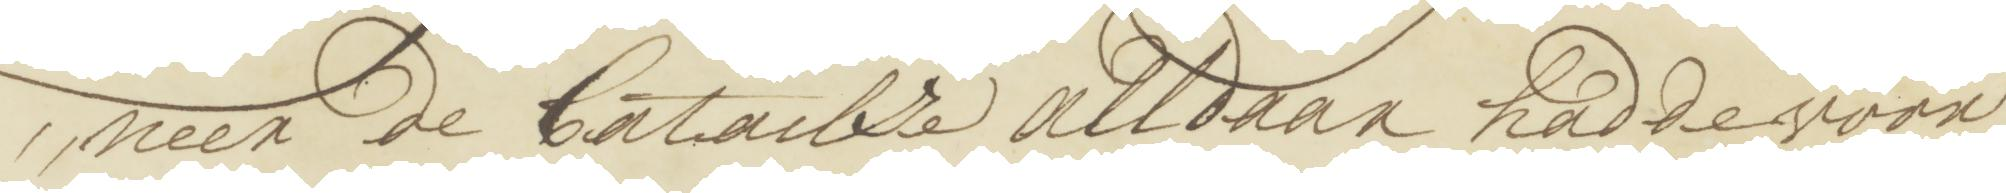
„neer de batailie alldaar hadde voor
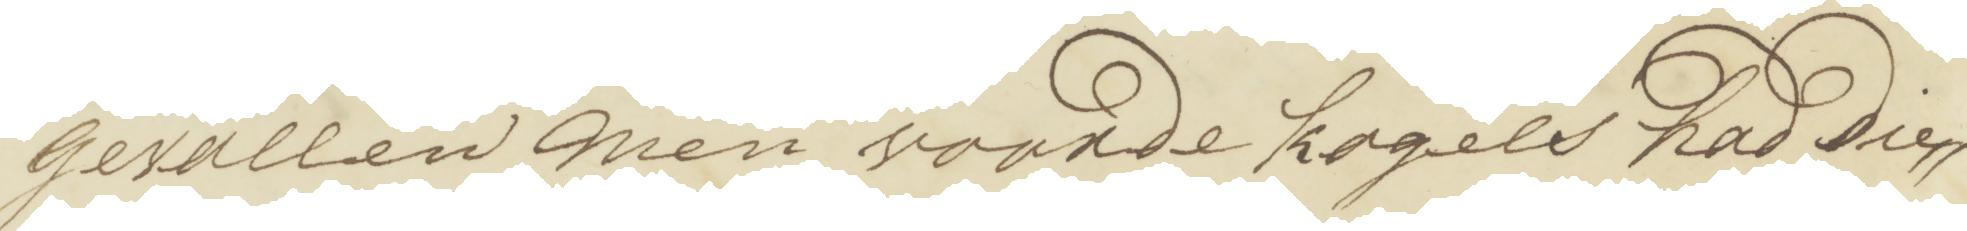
gevallen men voorde kogels had die
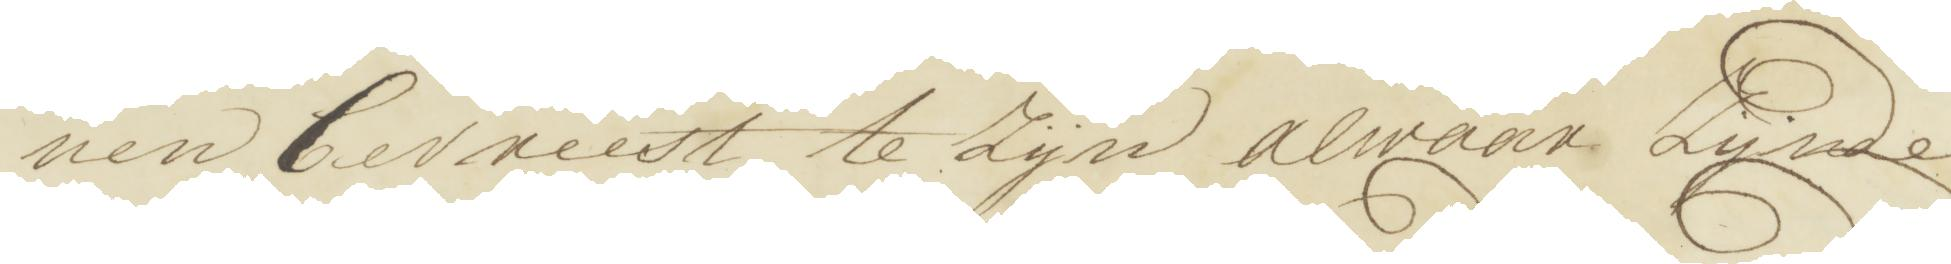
nen bevreest te zijn alwaar zijnde
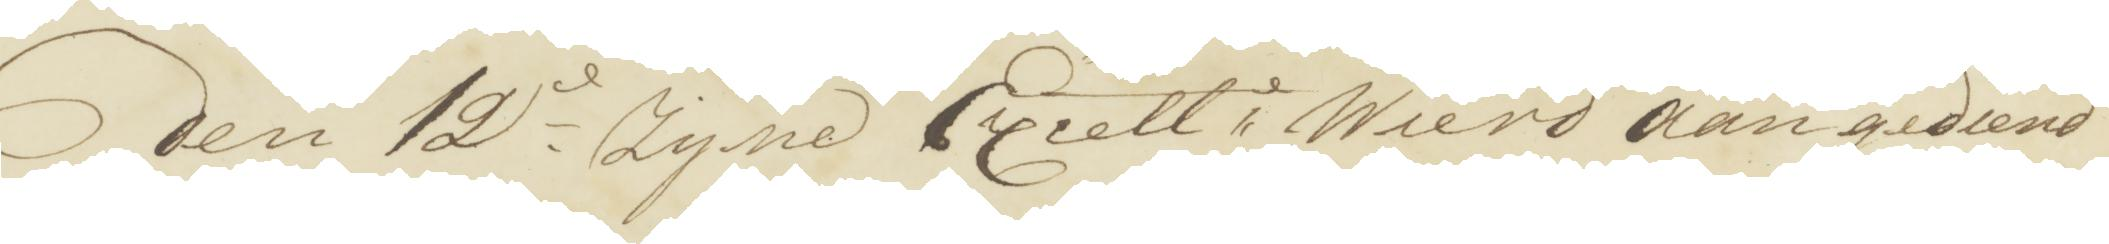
den 12=e zijne Excell„e wierd aan gediend
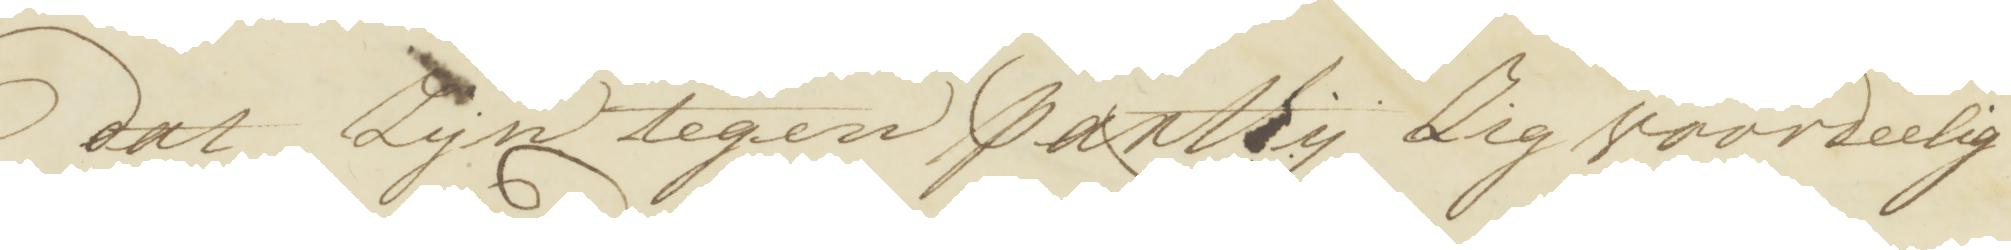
dat zijn tegen parthij zig voordeelig
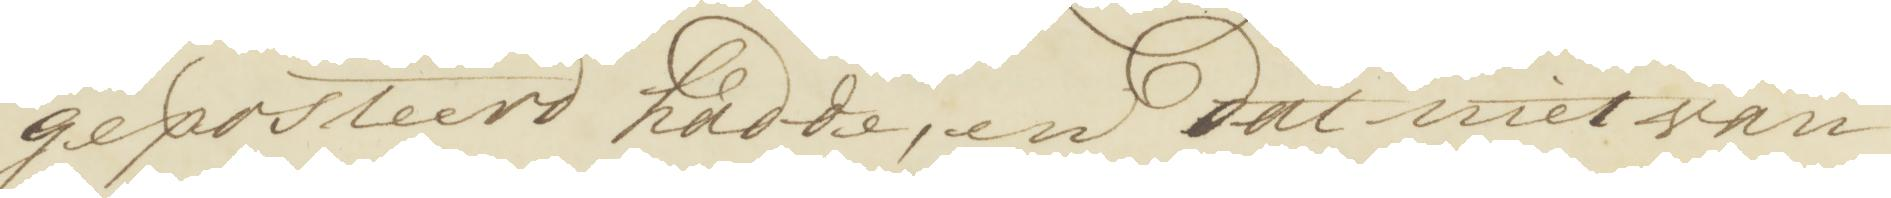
geposteerd hadde, en dat niet van
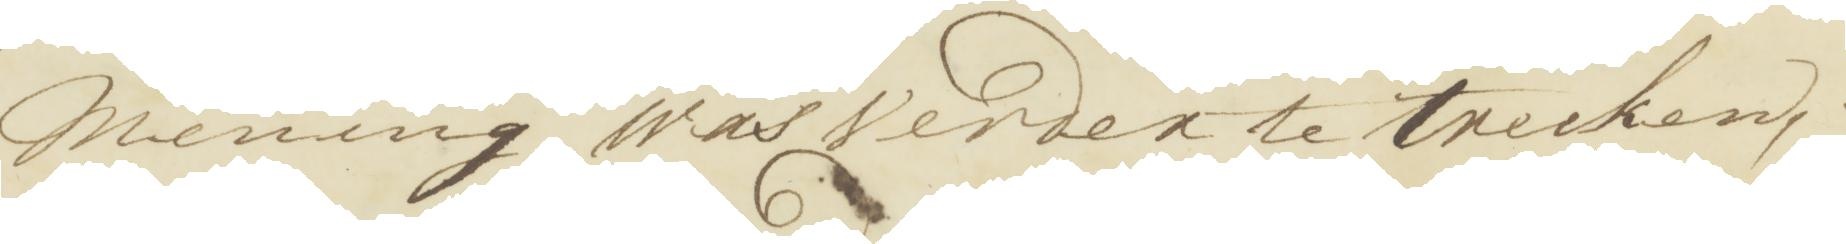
mening was verder te trecken,
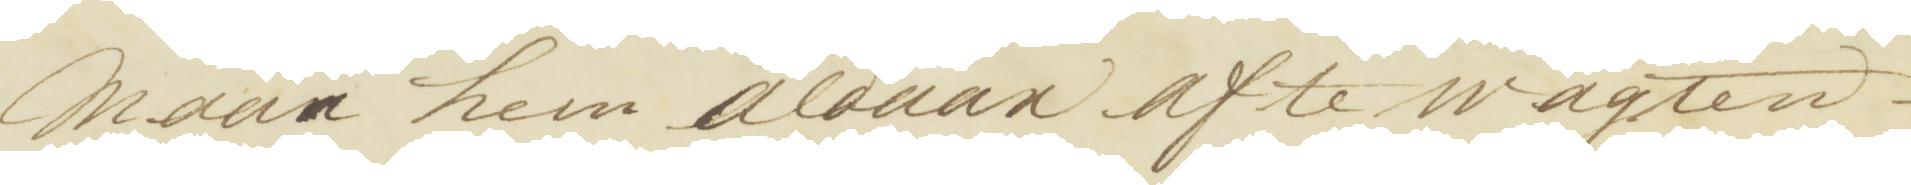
maar hem aldaar afte wagten-
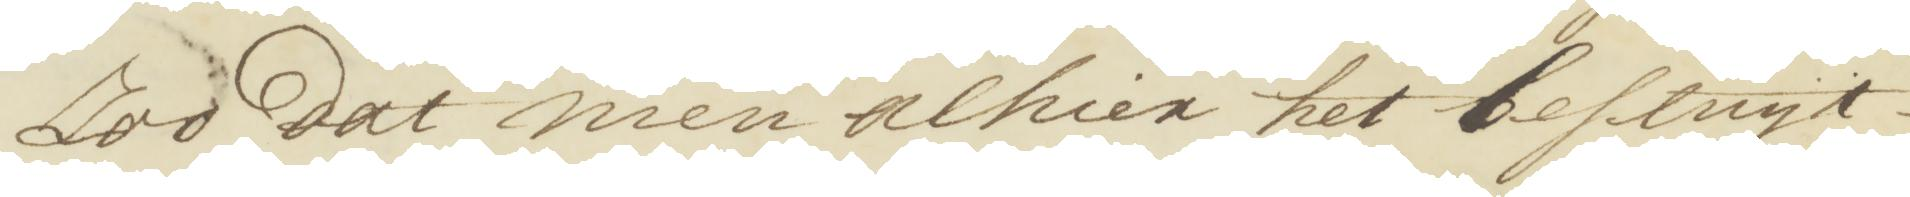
zoo dat men alhier het besluijt
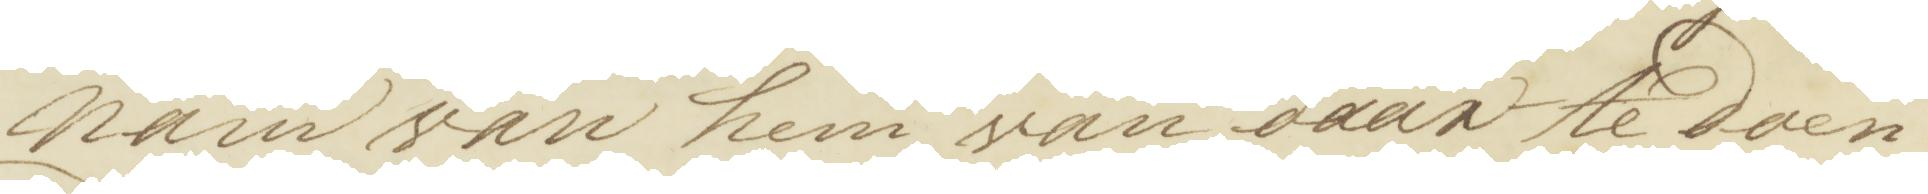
nam van hem van daar te doen
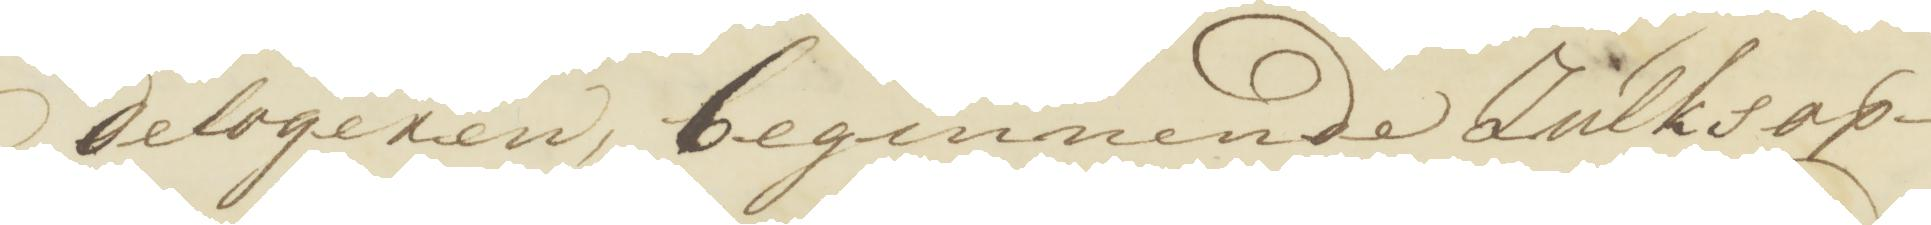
delogeren, beginnende zulks op-
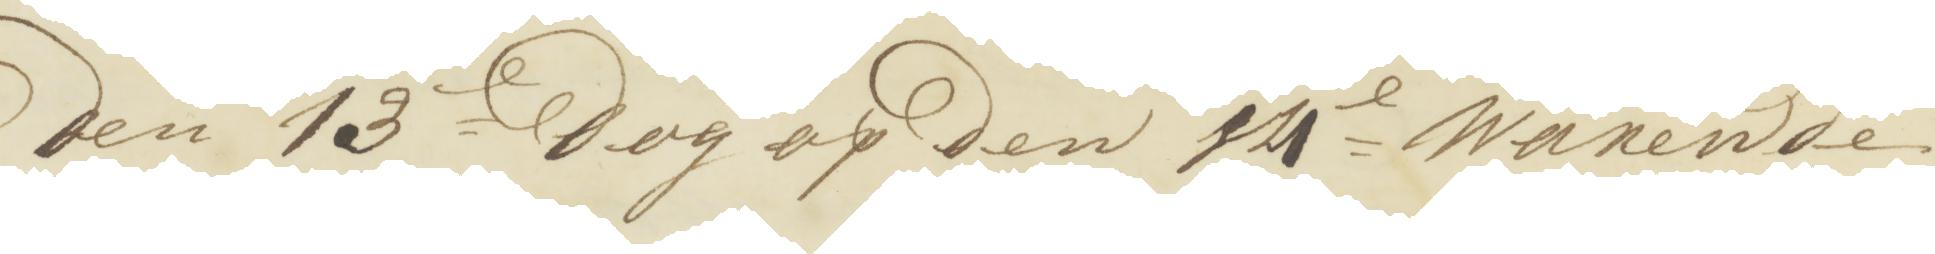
den 13=' dog op den 14=' waren de
